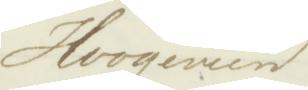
Hoogeveen
